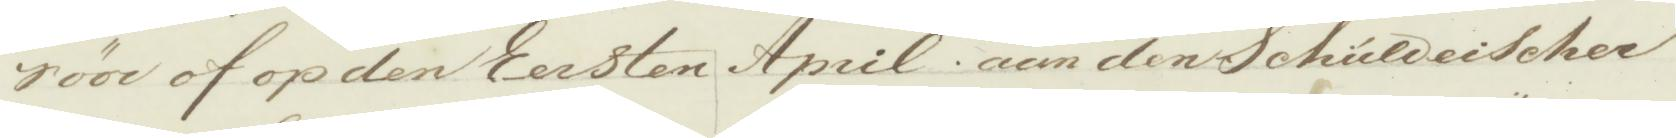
vóór of op den Eersten April: aan den schuldeischer
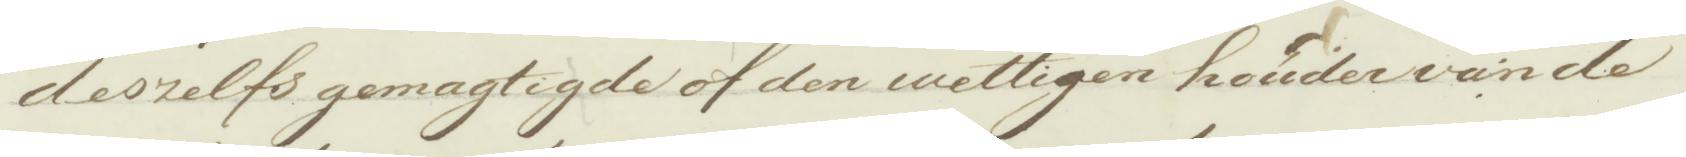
deszelfs gemagtigde of den wettigen houder van de
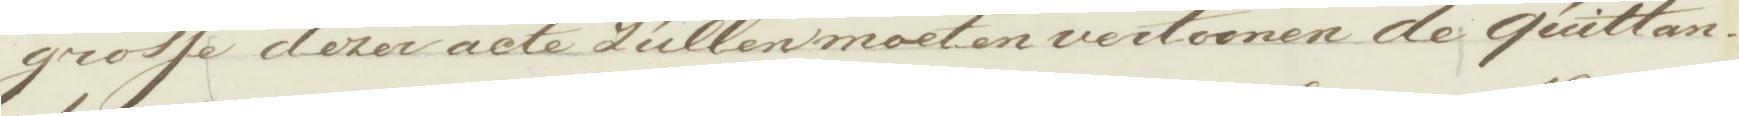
grosse dezer acte zullen moeten vertoonen de quittan.
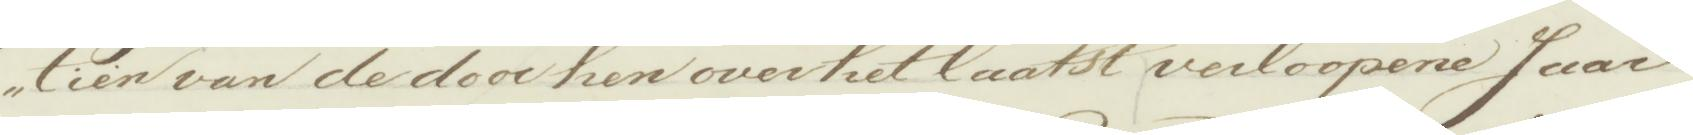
„tiën van de door hen over het laatst verloopene Jaar
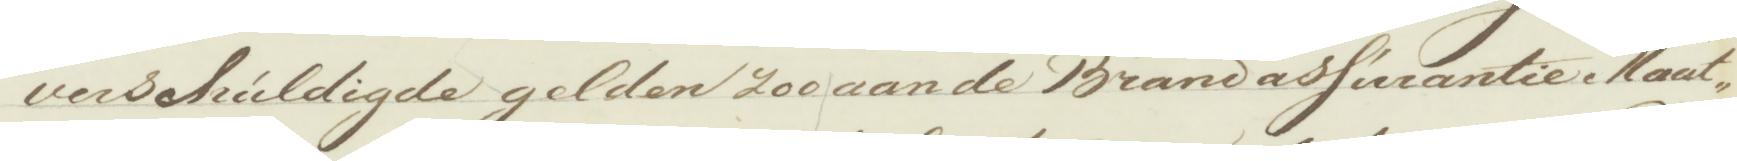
verschuldigde gelden zoo aan de Brand assurantie Maat„
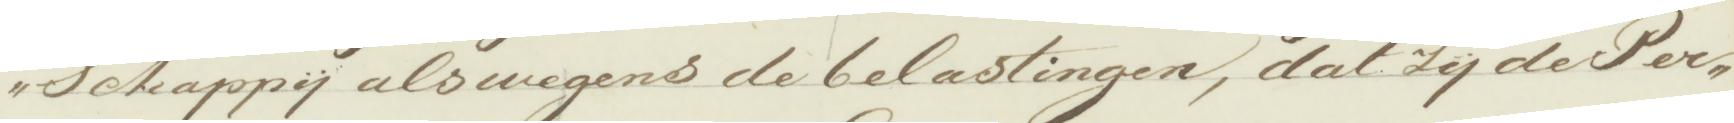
„schappij als wegens de belastingen, dat zij de Per„
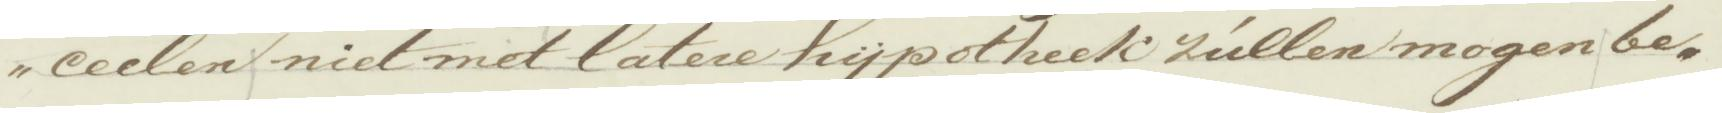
„ceelen niet met latere hijpotheek zullen mogen be„
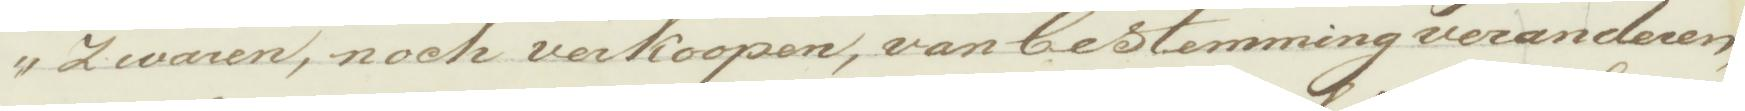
„zwaren, noch verkoopen, van bestemming veranderen
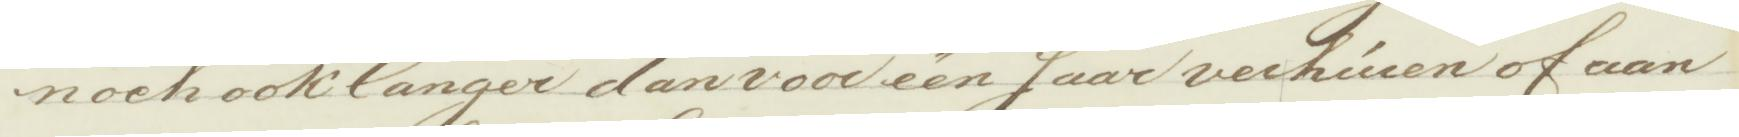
noch ook langer dan voor één Jaar verhuren of aan
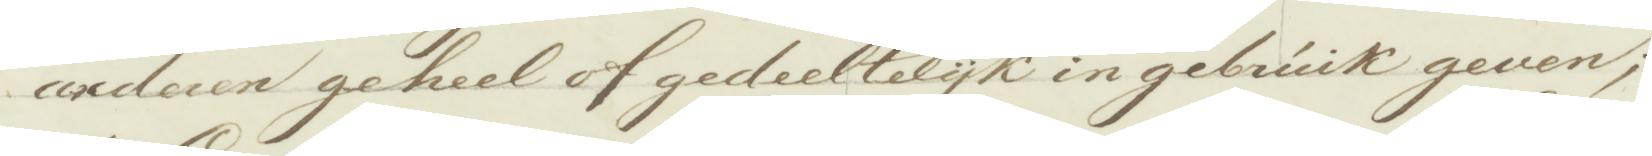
anderen geheel of gedeeltelijk in gebruik geven,
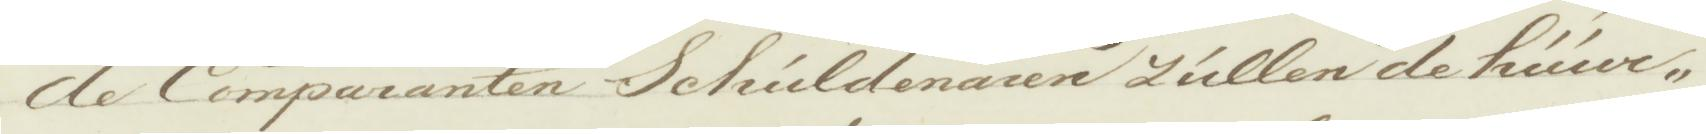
de Comparanten Schuldenaren zullen de huur„
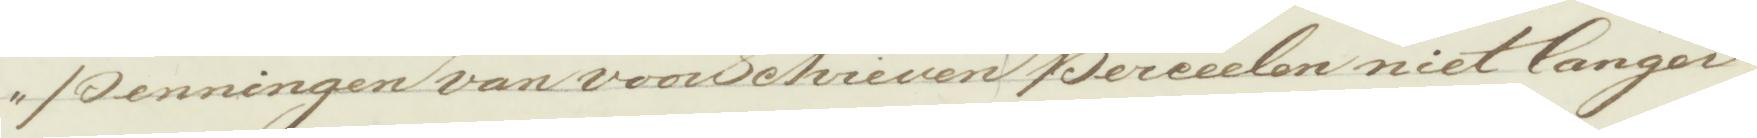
„penningen van voorschreven perceelen niet langer
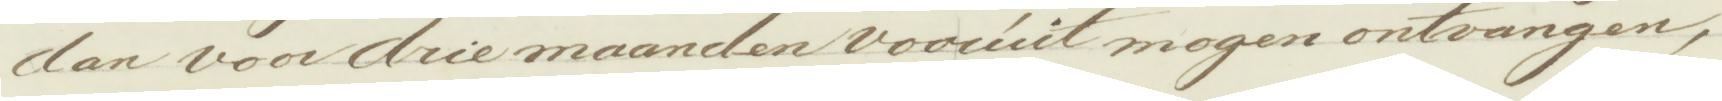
dan voor drie maanden vooruit mogen ontvangen,
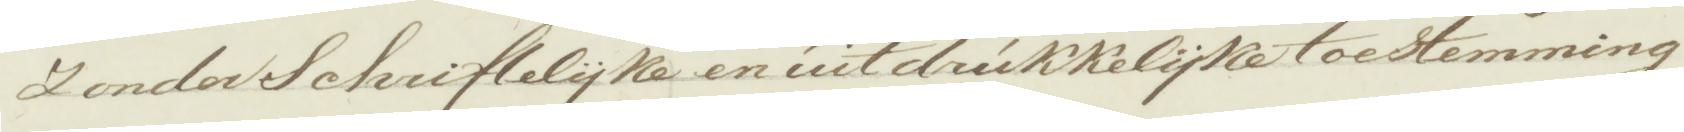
zonder schriftelijke en uitdrukkelijke toestemming
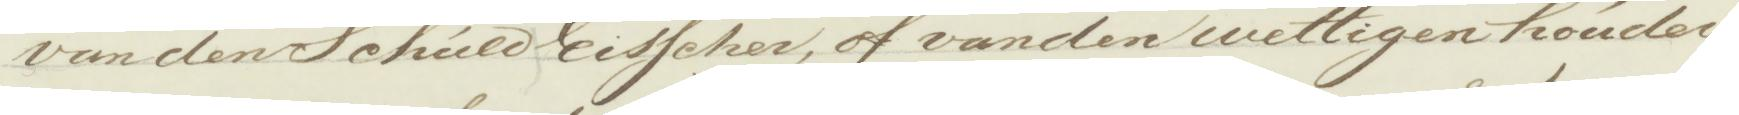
van den Schuld Eisscher, of van den wettigen houder
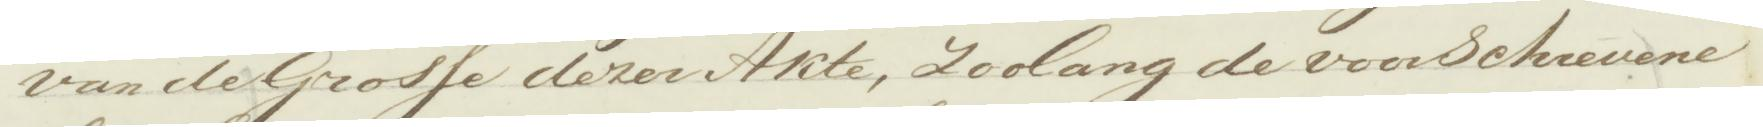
van de Grosse dezer Akte, zoolang de voorschrevene
